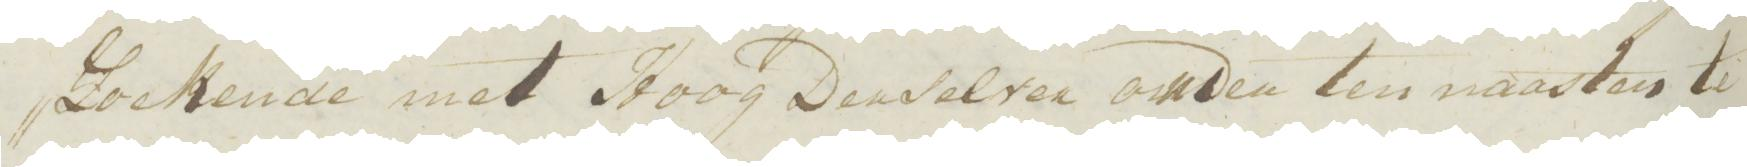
zoekende met Hoog derselver onder ten naastein te
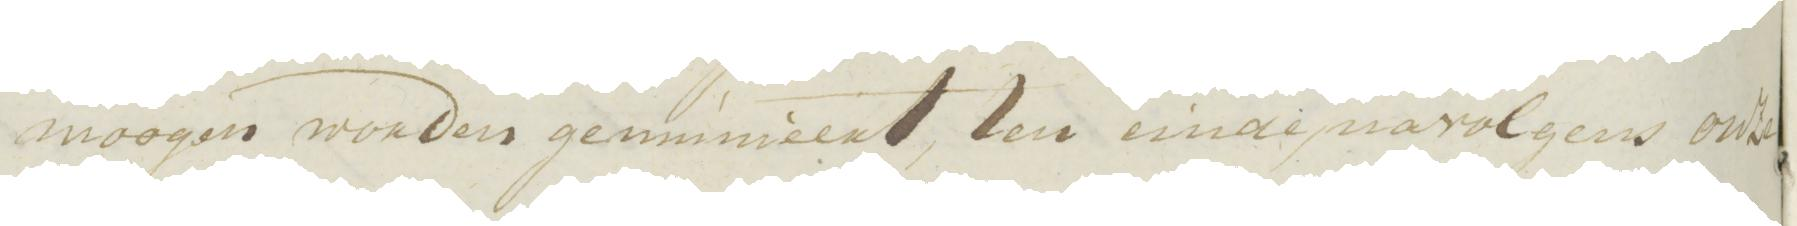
moogen worden gemunieert, ten einde navolgens onser
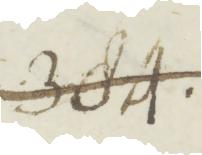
Ho.
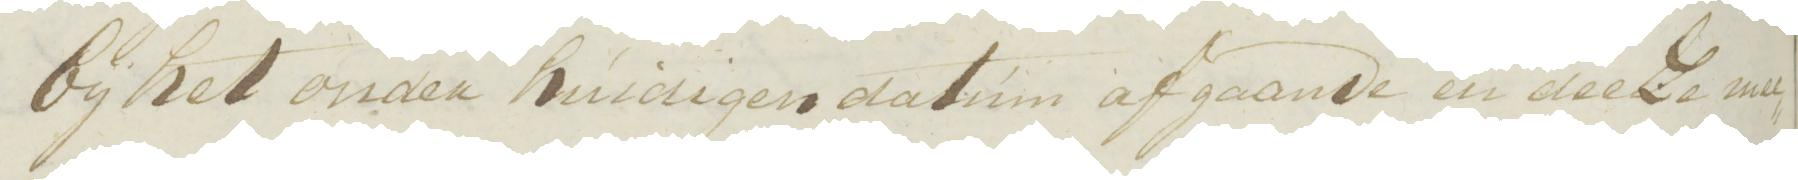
bij het onder huidrigen datum afgaande en deeze men
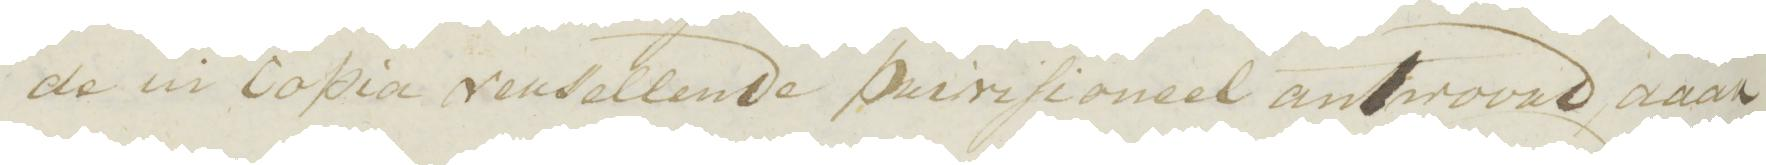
de in Copia versellende privisioneel antwoord, daar
